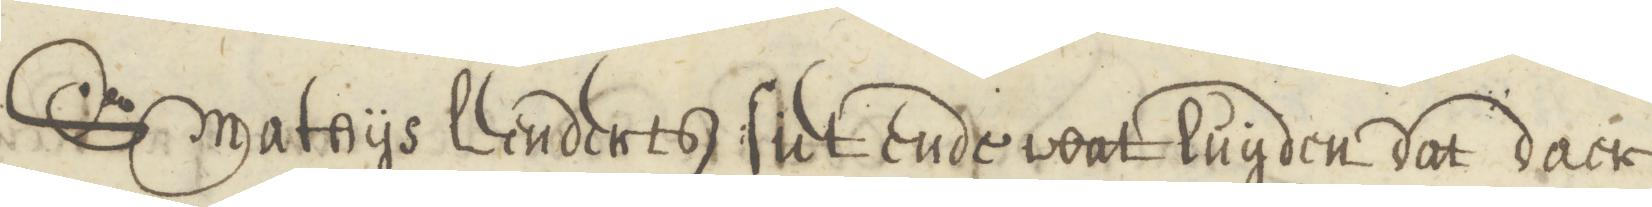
Sr Mathijs Leendertsz siet ende wat luijden dat daer
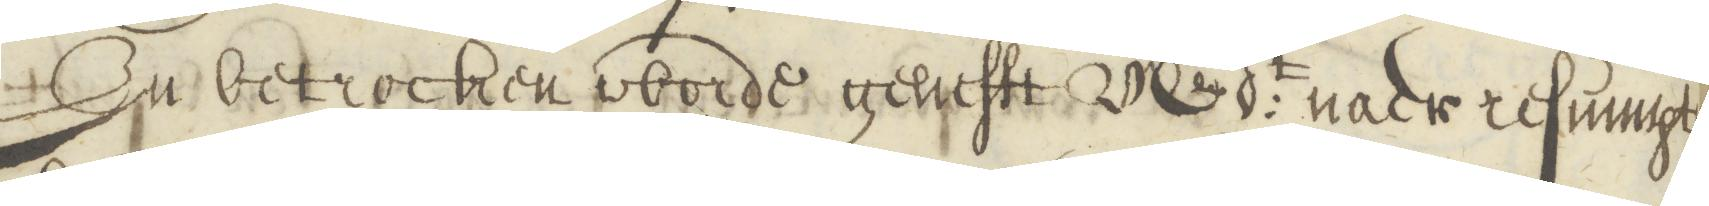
Jn betrocken worde geliefft VEd:t naer resumpt
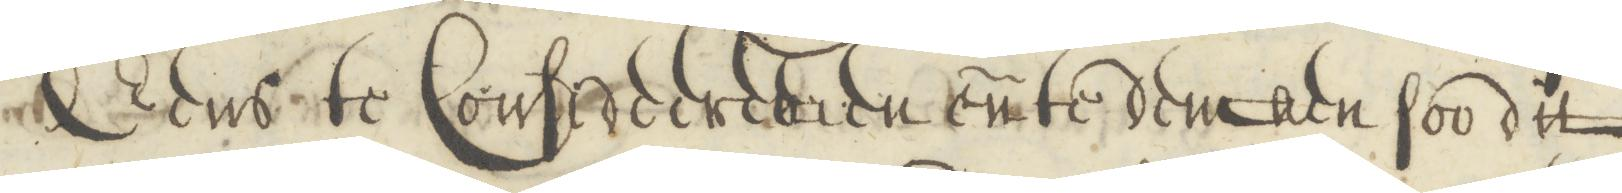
Eens te Considereeren ende te dencken soo dit
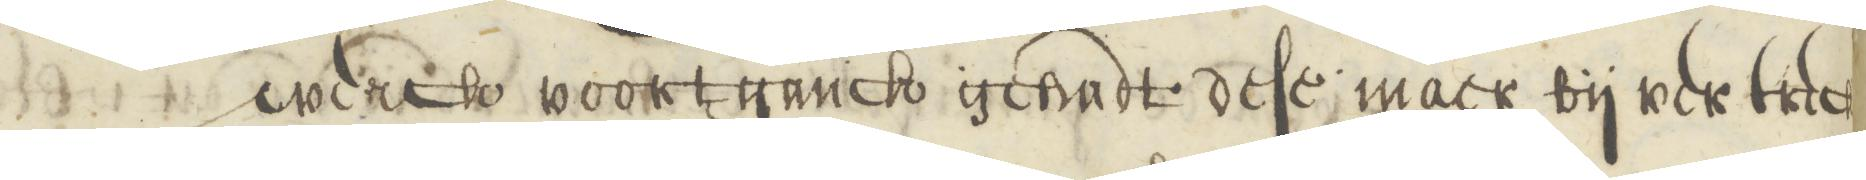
werck voortganck gehadt dese maer bij vertreck
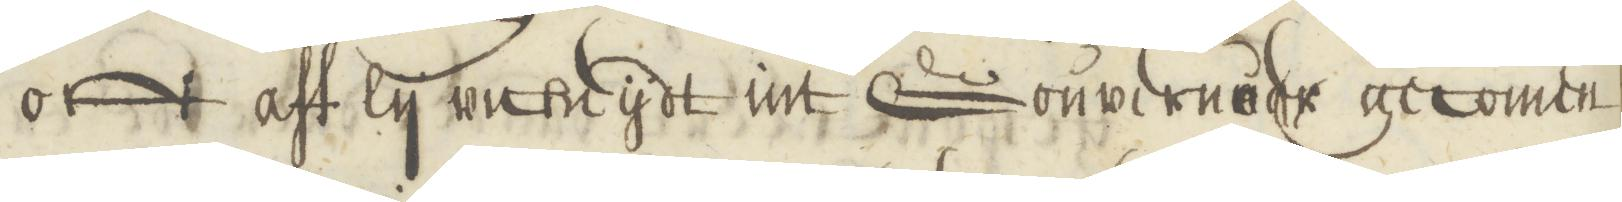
off afflijvicheijdt int Gouverneer gecomen
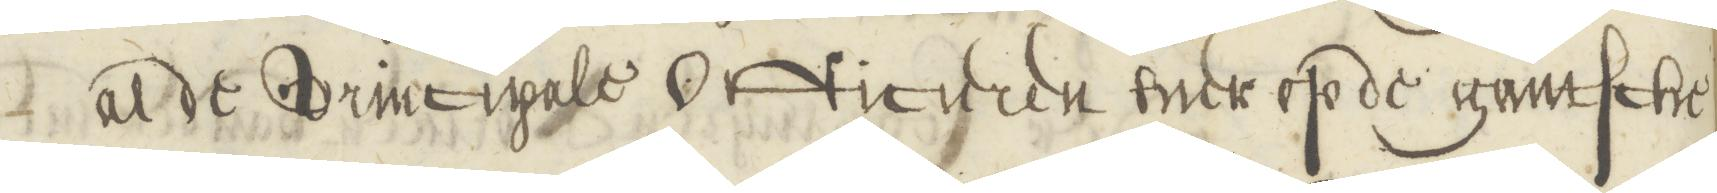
al de principale officieren hier op de gantsche
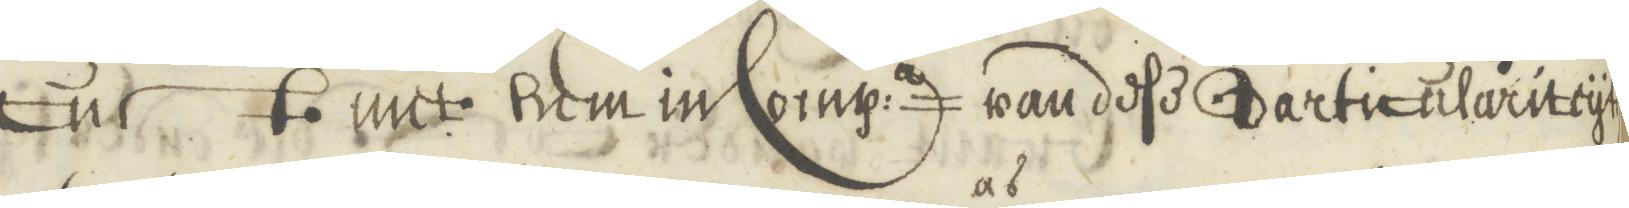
custe met hem in Comp:=a van dese particulariteijt
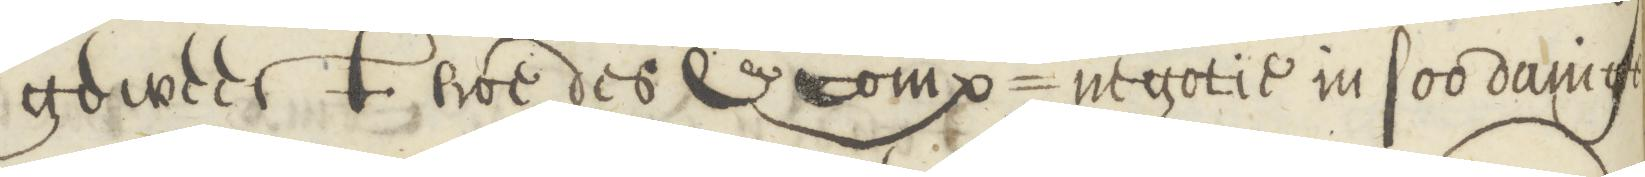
geweest het des E Comp=as negotie in soodanige
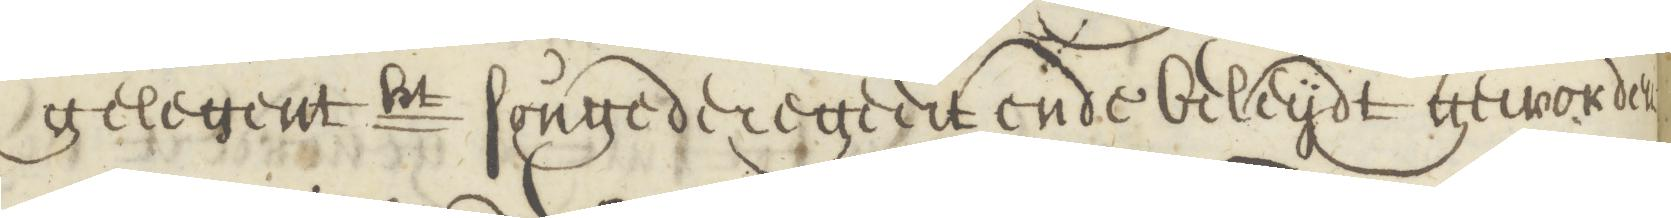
gelegenth=t sougederegeert oude beleijdt geworden
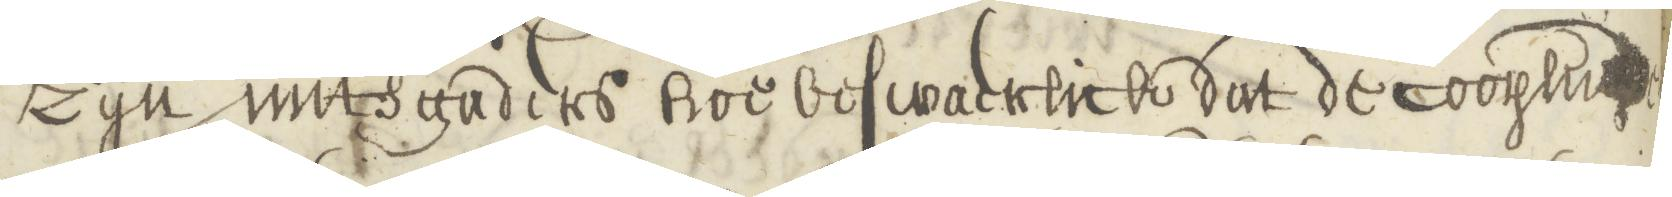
zijn mitsgaders hoe beswaerlick dat de cooplude
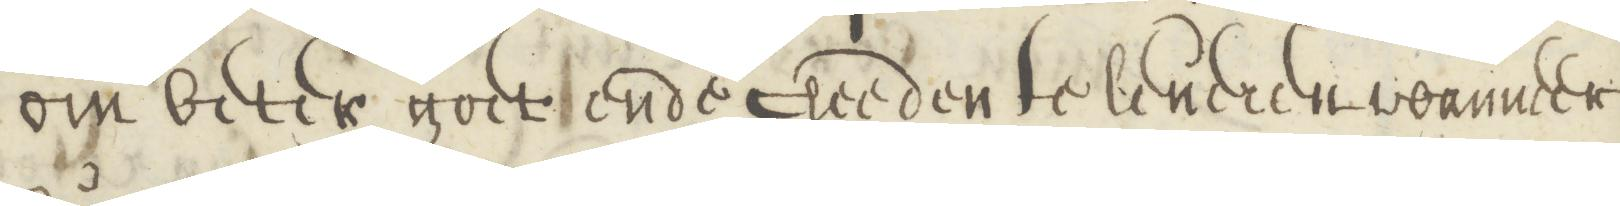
om beter goet ende cleeden te leueren wanneer
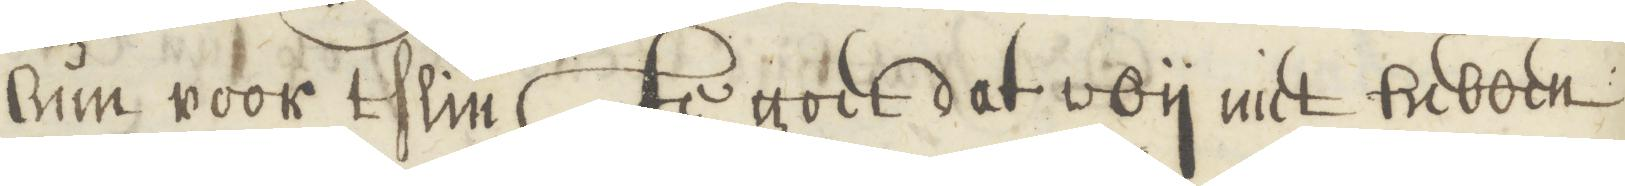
hun voor t slinck goet dat wij niet hebben
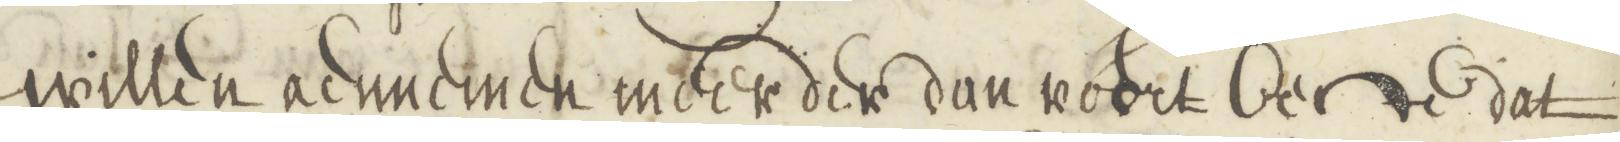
willen aennemen meerder dan voort beste dat
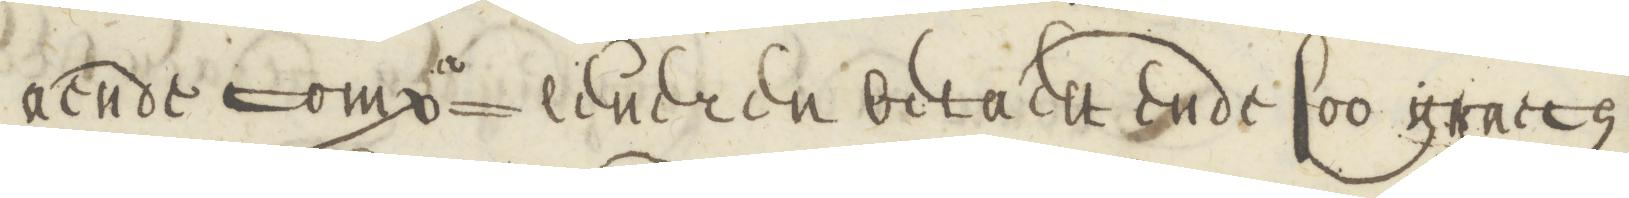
aende comp=a leueren betaelt ende soo graech
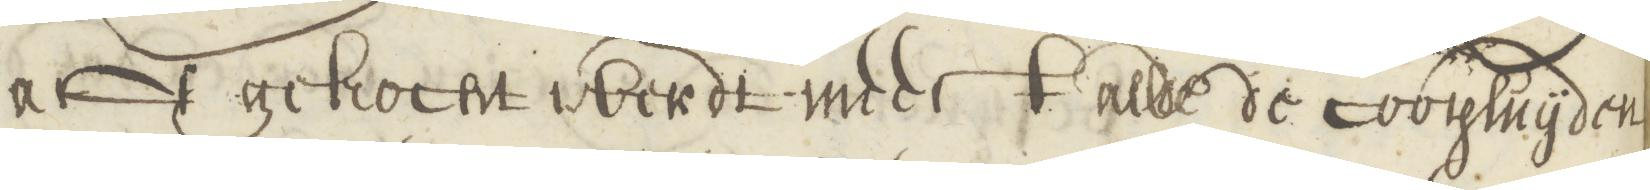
aff gekocht werdt meest alle de coopluijden
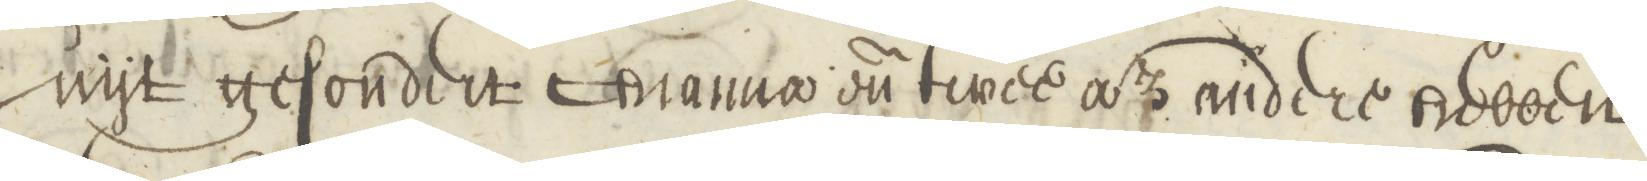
uijt gesondert chianna ende twee a 3 andere hebben
